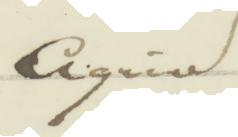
Aqua
